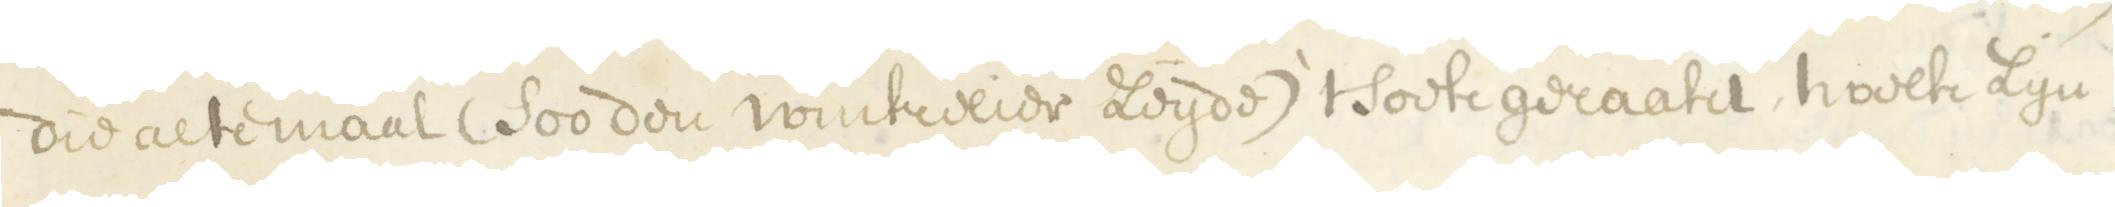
die altemaal (soo den winkelier zeijde) ’tsoek geraakt, twelk zijn
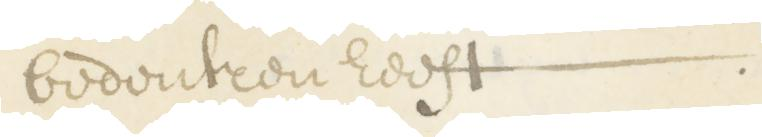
bedenken heeft.
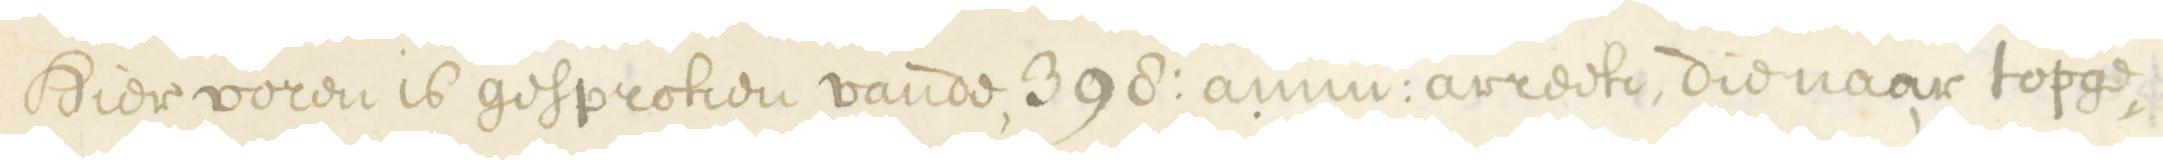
Hier voren is gesproken vande 398: amm:s arreek, die naar 't opge„
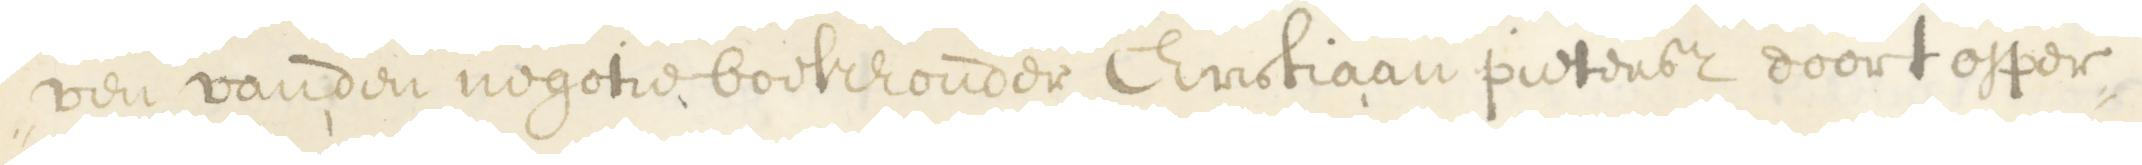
„ven van den negotie boekhouder Christiaan pietersz door't opper„
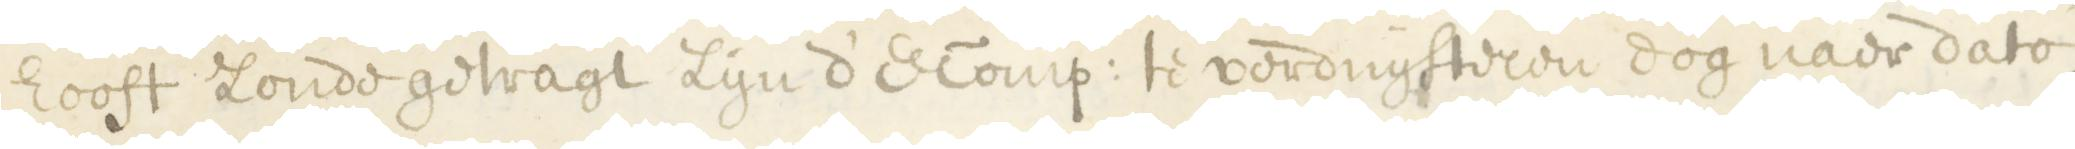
hooft zoude getragt zijn d' EComp: te verduijsteren dog naer dato
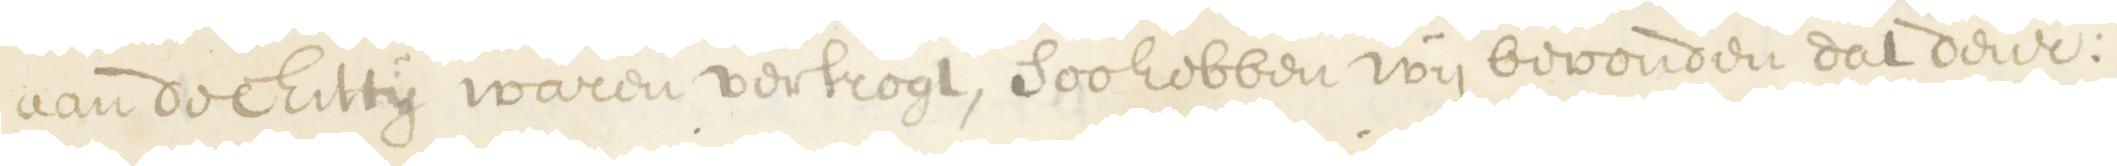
aan dechittij waren verkogt, soo hebben wij bevonden dat denr:t
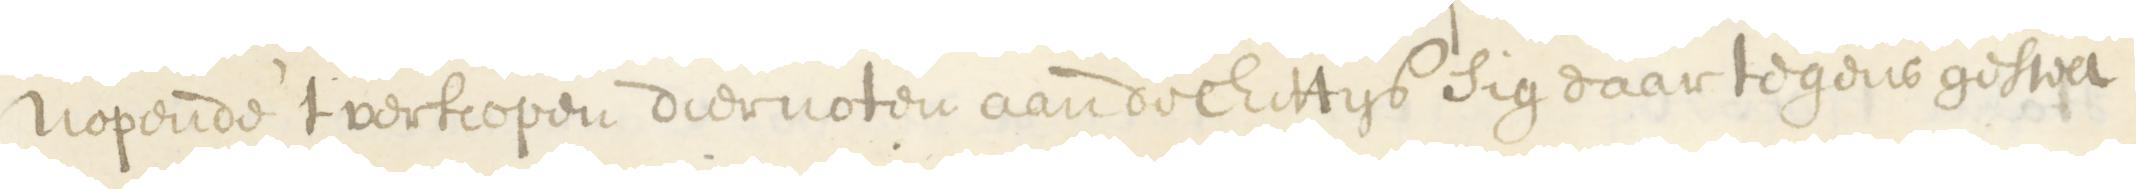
nopende ’t verkopen diernoten aan dechittijs sig daar tegens gestelt
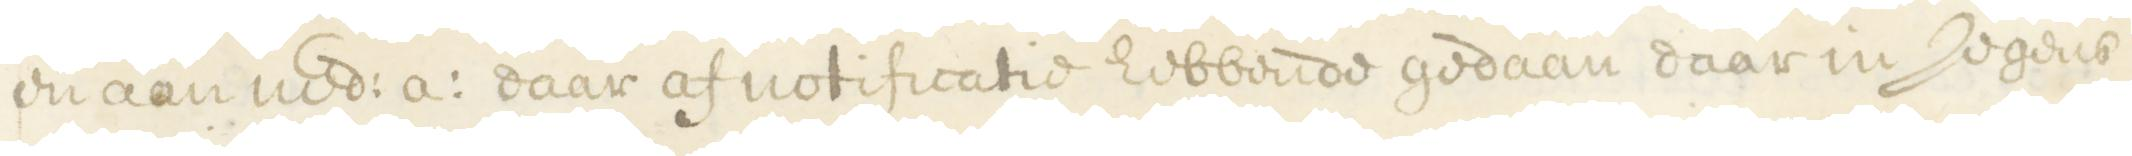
en aan uEd: a: daar af notificatie hebbende gedaan daar in Jegens
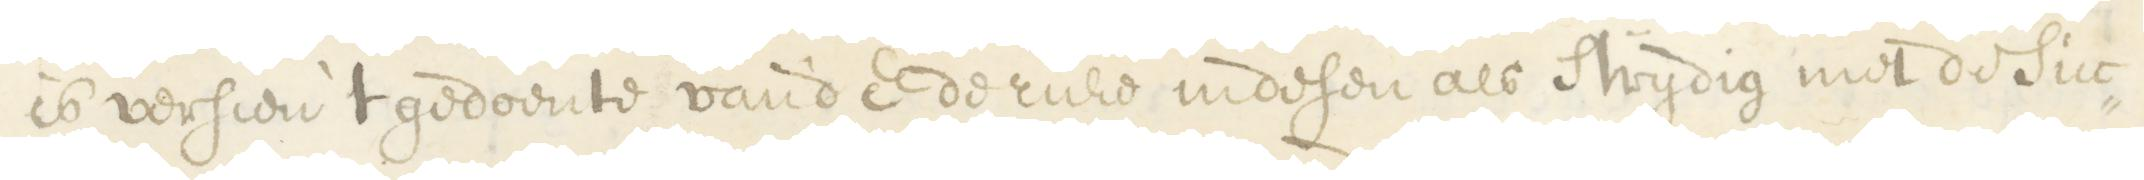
is versien ’t gedoente van d’ E de ruhe indesen als strijdig met de suc„
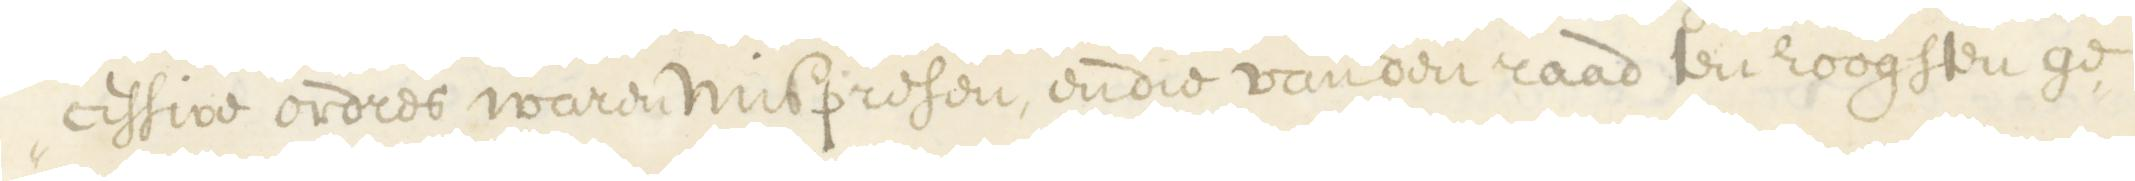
„cissive ordres waren mispresen, en die van den raad ten hoogsten ge„
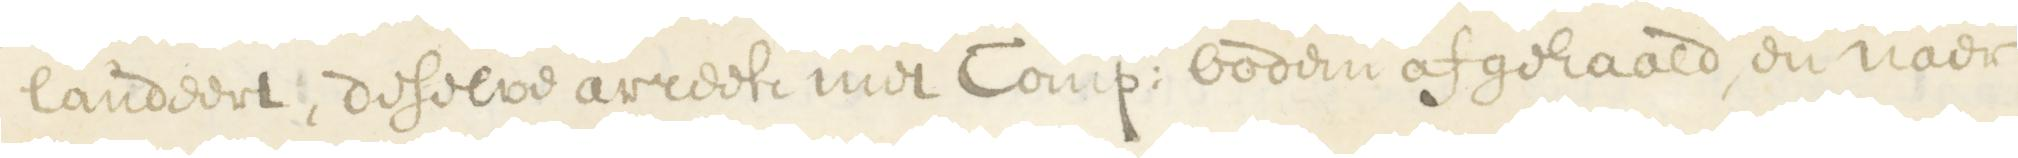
landeert, deselve arreek met Comp:es bodem afgehaald, en naer
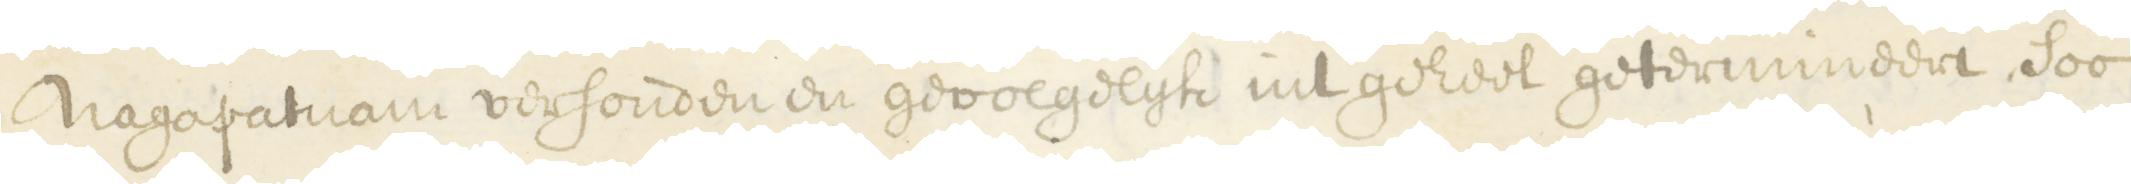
nagapatnam versonden en gevolgelijk int geheel getermineert soo
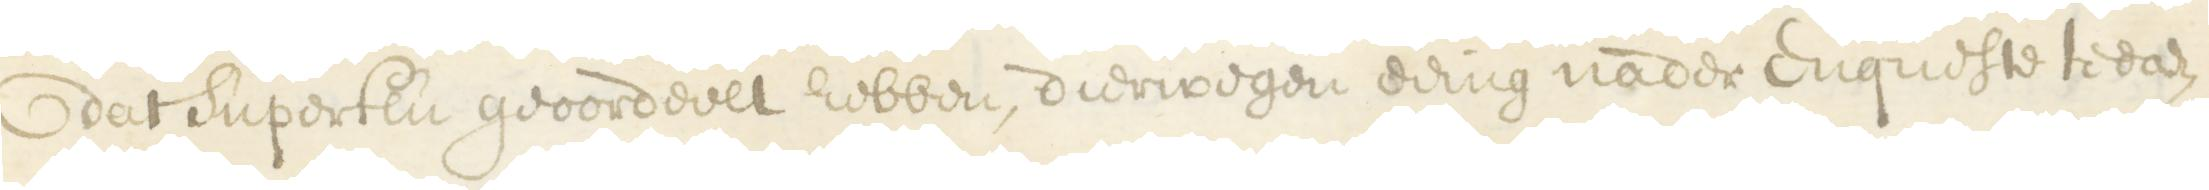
dat superflu geoordeelt hebben, dierwegen eenig nader Enqueste te doen
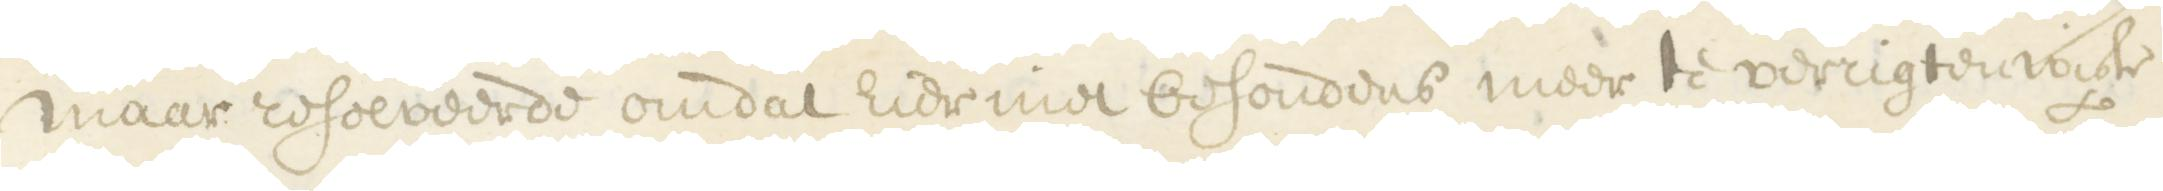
maar resolveerde omdat hier niet besonders meer te verrigten wiste
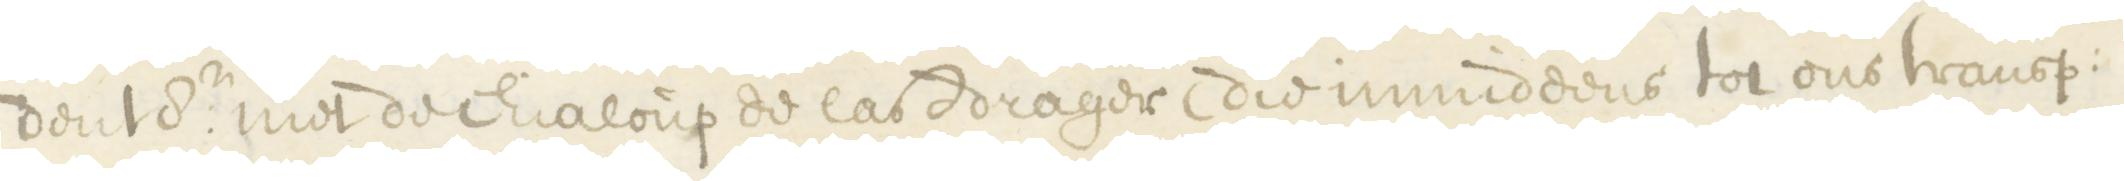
den 18:' met dechialoup de lastdrager (die inmiddens tot ons transp:
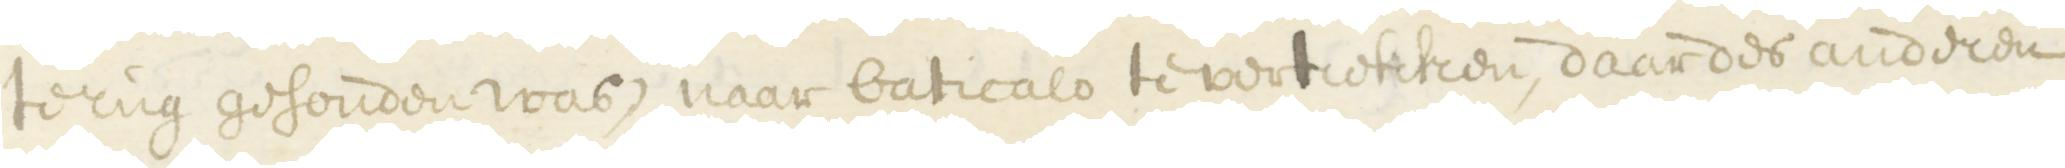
terug gesonden was) naar baticalo tevertrekken, daar des anderen
